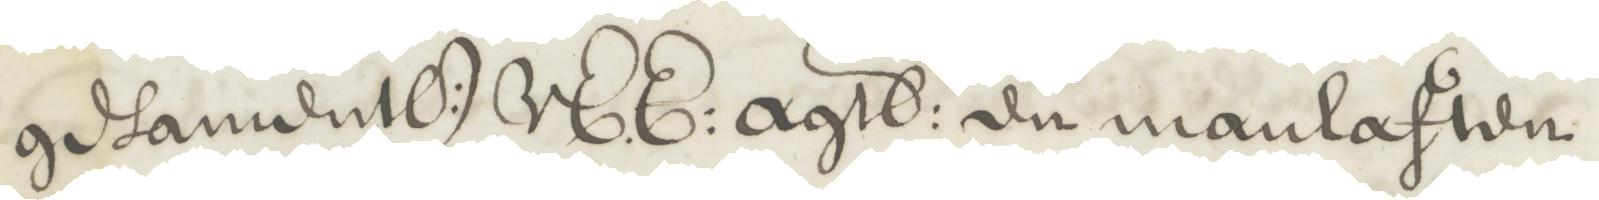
gesamentlijk VEE: agtb: en manhaften
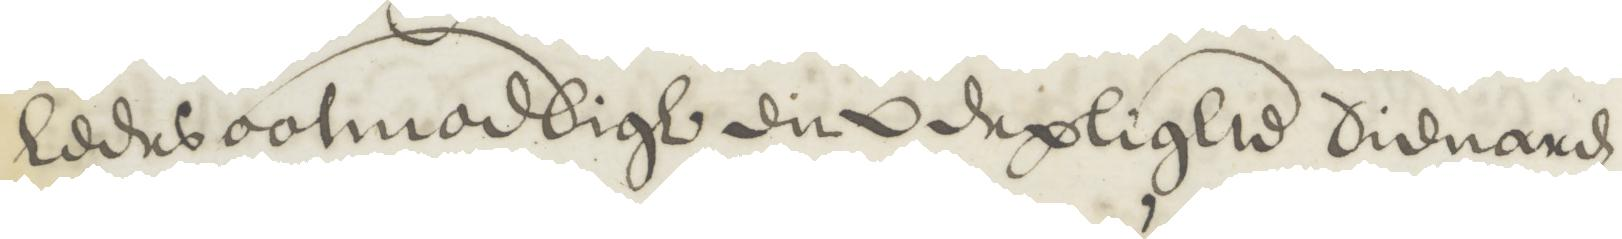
heers ootmoedigh en verplighte dienaren
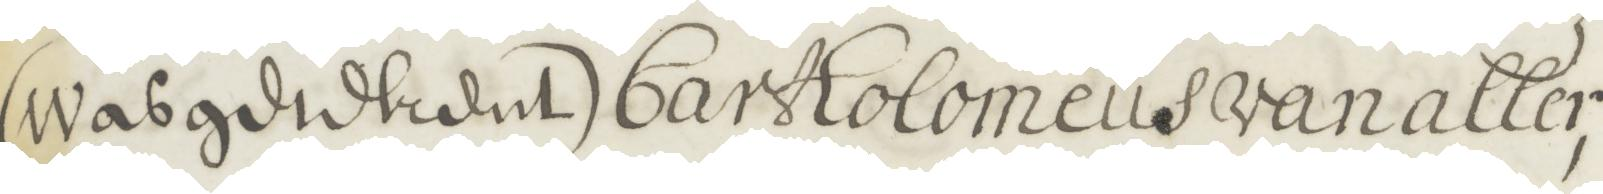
(was getekent) bartholomeus van aller,
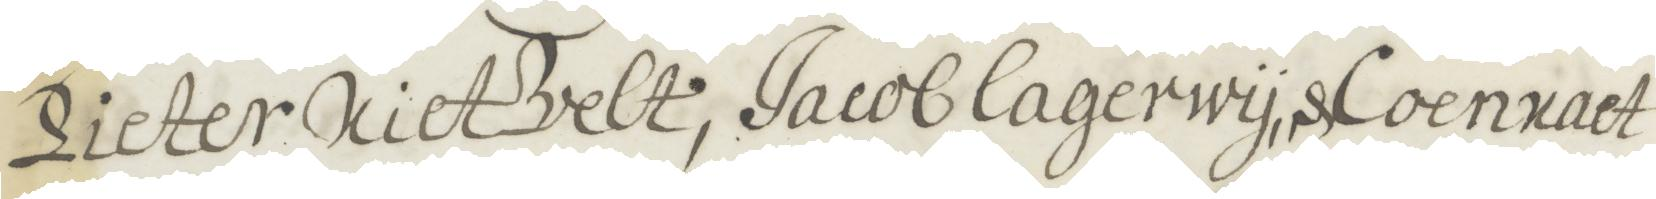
Pieter rietvelt, Iacob Lagerwij, en Coenraet
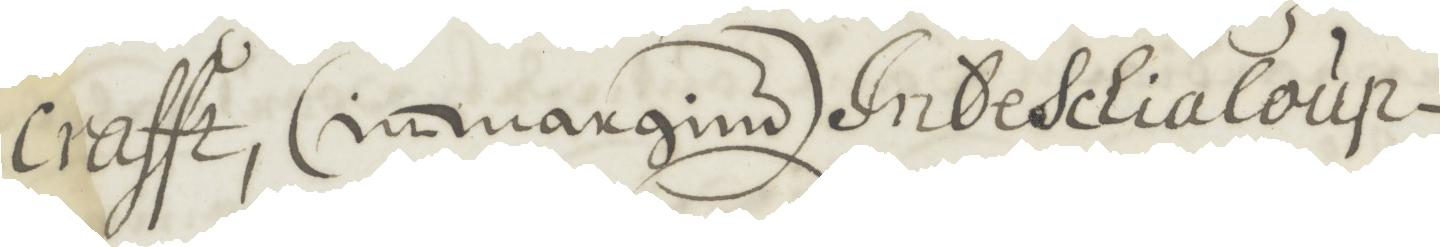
crafft, (in margine) In deschialoup
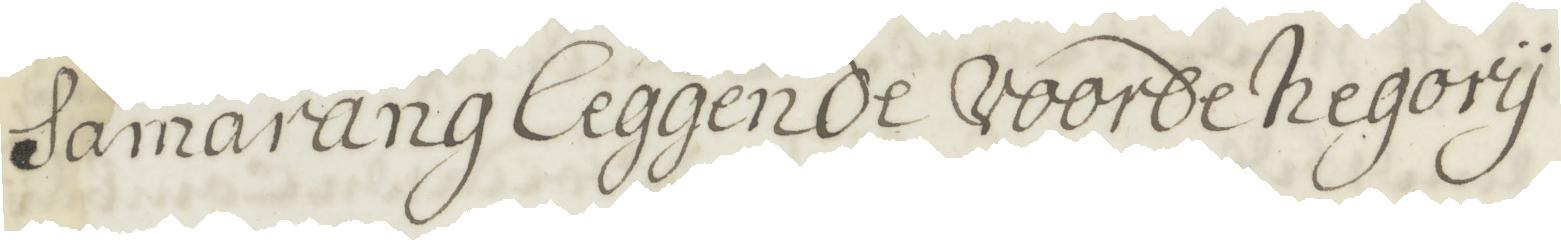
samarang leggende voorde negorij
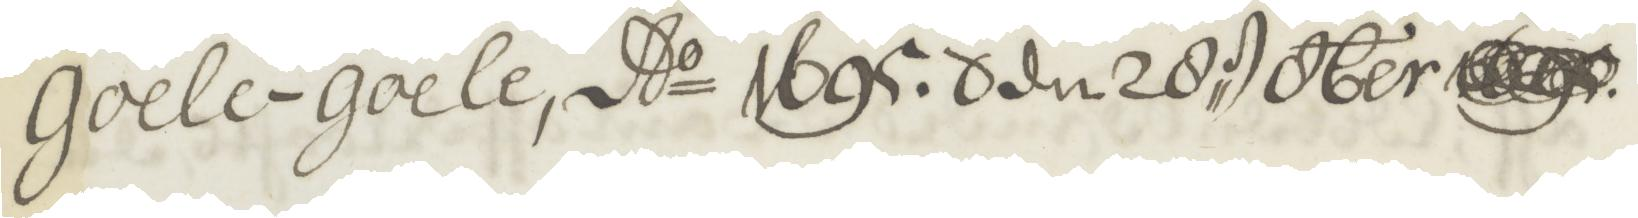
goele-goele, A=o 1695. den 28„en 8ber 1695.
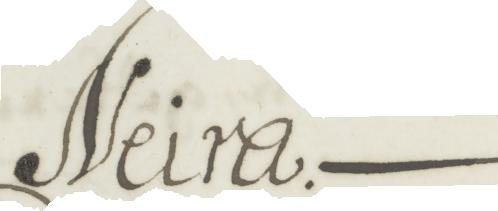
Neira. —
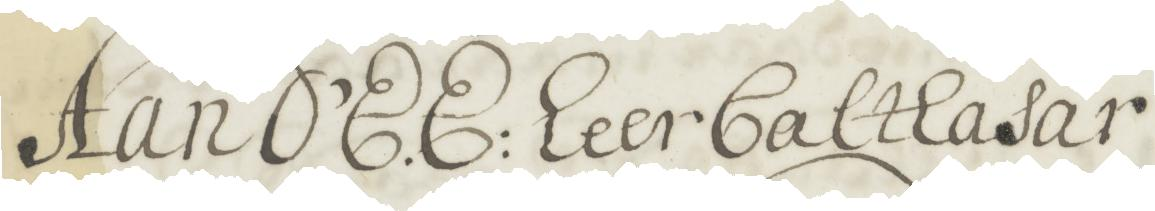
Aan d’ E.E: heer balthasar
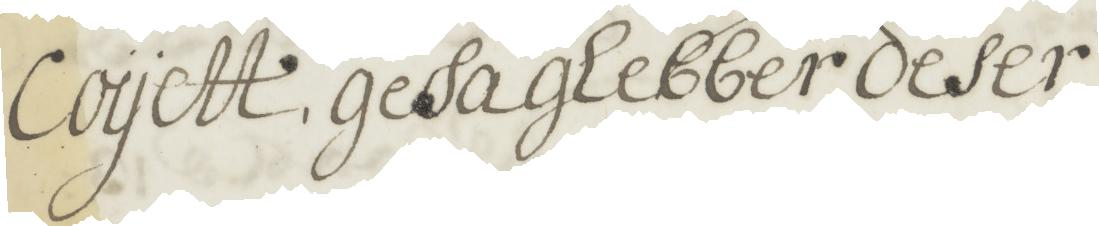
Coijett, gesaghebber deser
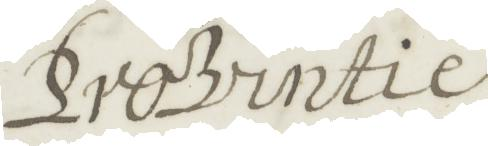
Provintie
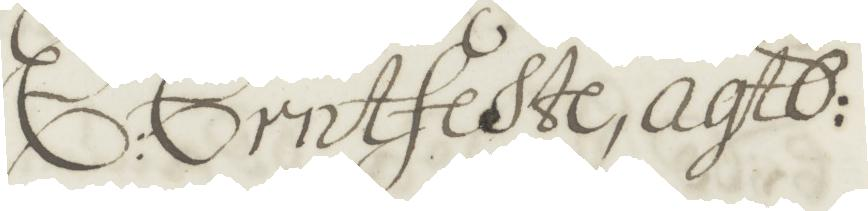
E: Erntfeste, agtb:
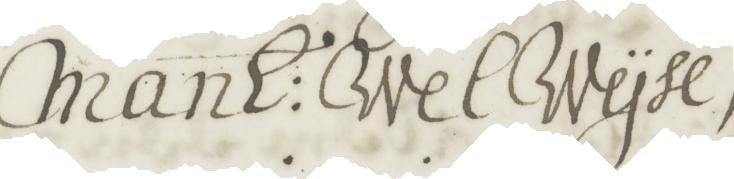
manh: wel wijse,
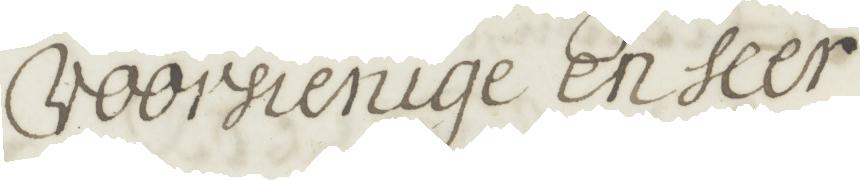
voorsienige en seer
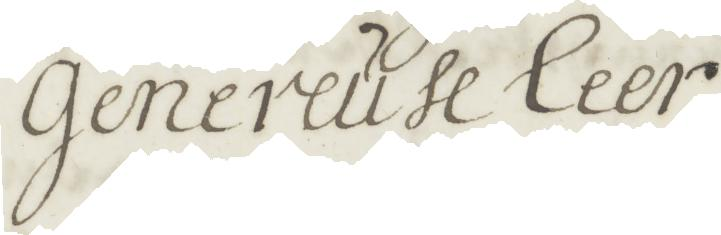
genereuse heer,
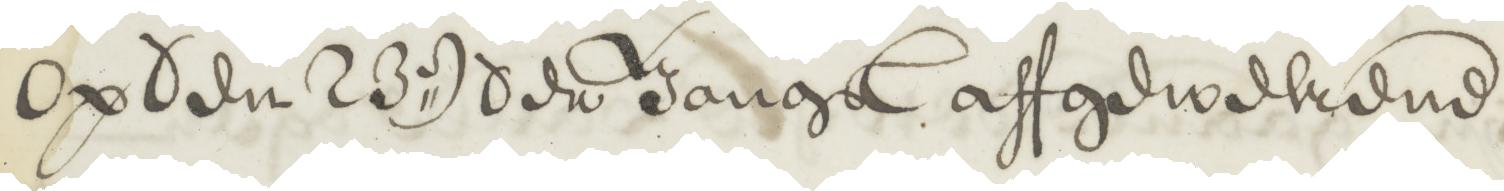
op den 23„en der Jongst affgewekene
